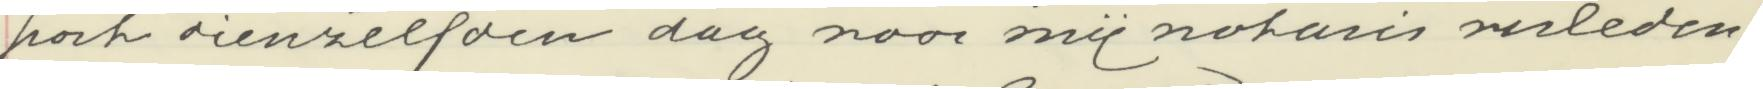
port dienzelfden dag voor mij notaris verleden
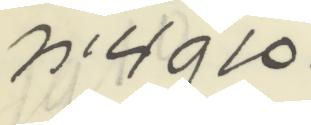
n: 4910
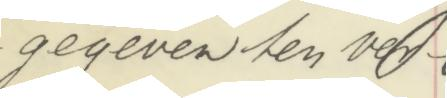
gegeven ten ver
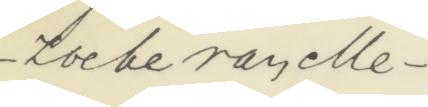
-zoeke van Me-
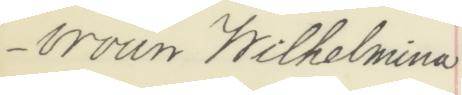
-vrouw Wilhelmina
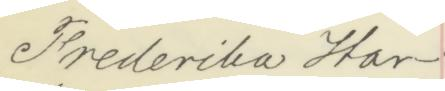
Frederika Har
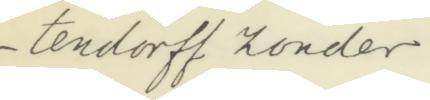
-tendorff zonder
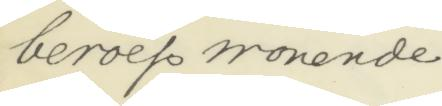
beroep wonende
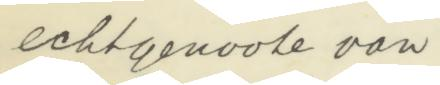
echtgenoote van
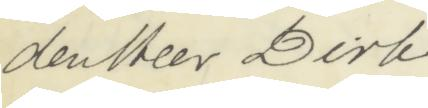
den Heer Dirk
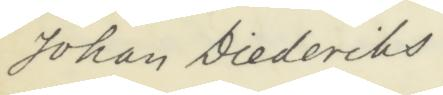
Johan Diederiks
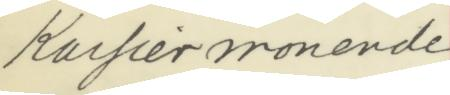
Kassier wonende
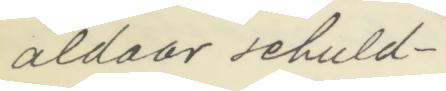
aldaar schuld-
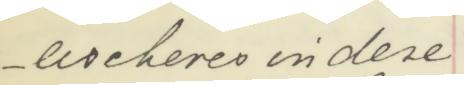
-eischeres in deze
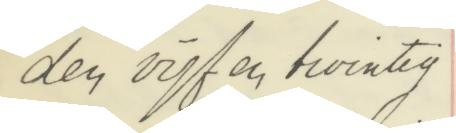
den vijf en twintig
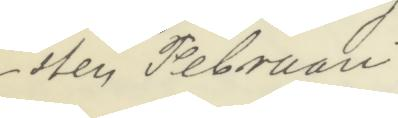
-sten Februari
